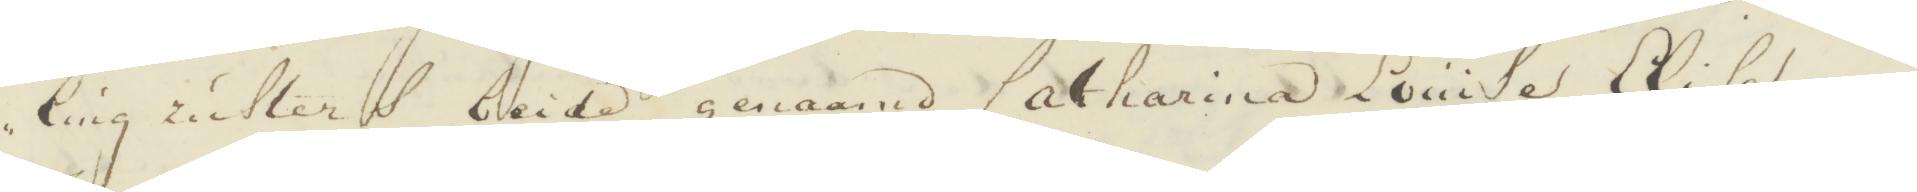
„ling zusters beide genaamd Catharina Louise Elise en
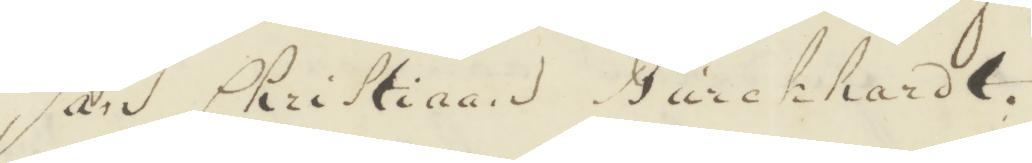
Jan Christiaan Burckhardt,
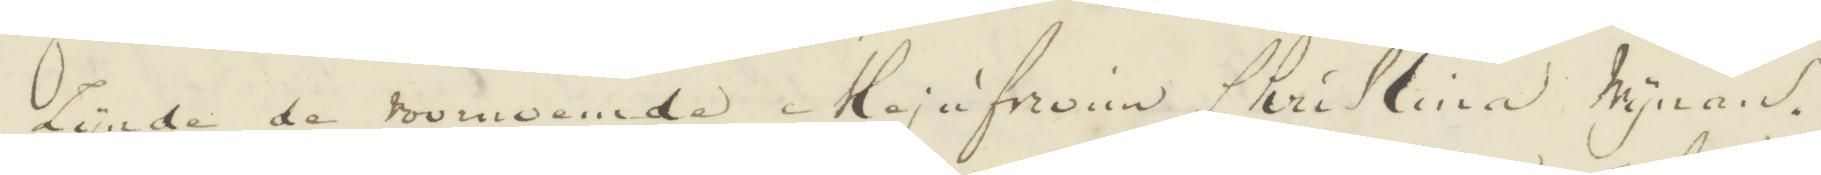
Zijnde de voornoemde Mejufvrouw Christina Wijnan„
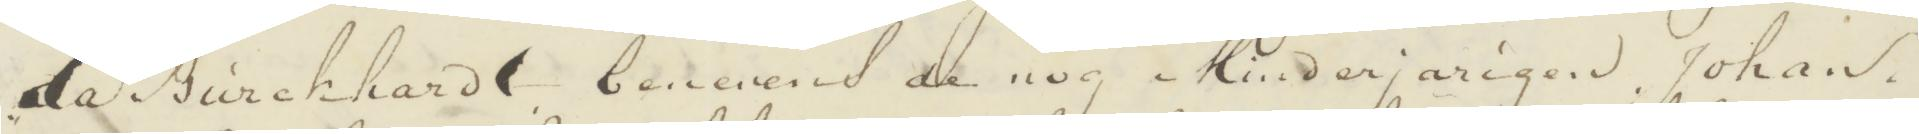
da Burckhardt, benevens de nog Minderjarigen Johan„
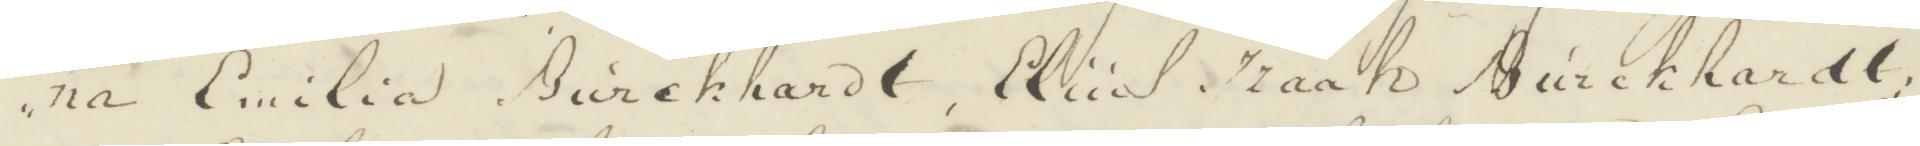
„na Emilia Burckhardt, Elias Izaak Burckhardt,
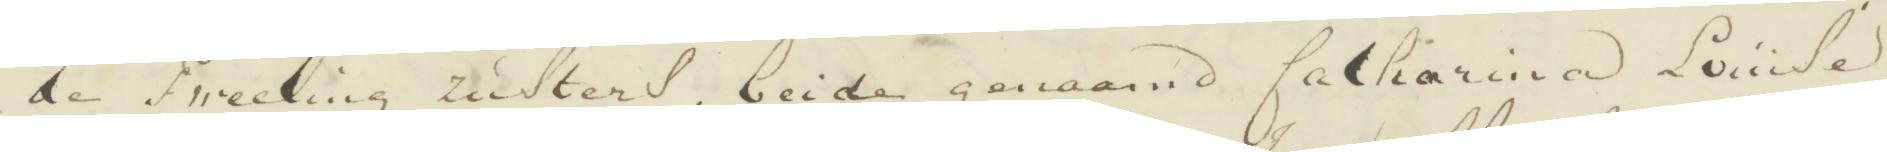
de Tweeling zusters, beide genaamd Catharina Louise
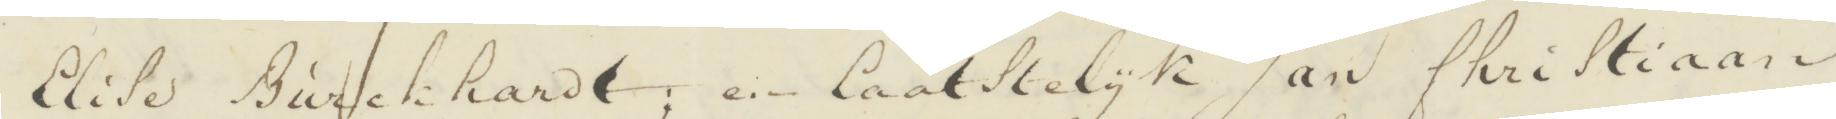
Elise Burckhardt; en laatstelijk Jan Christiaan
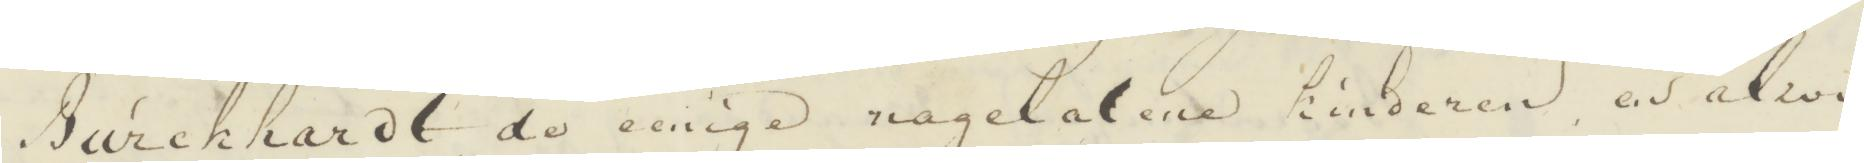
Burckhardt, de eenige nagelatene kinderen, en alzoo
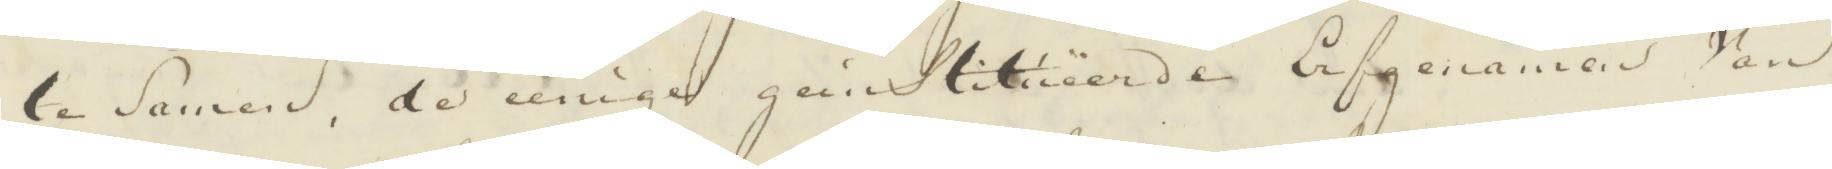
te samen, de eenige geinstituëerde Erfgenamen van
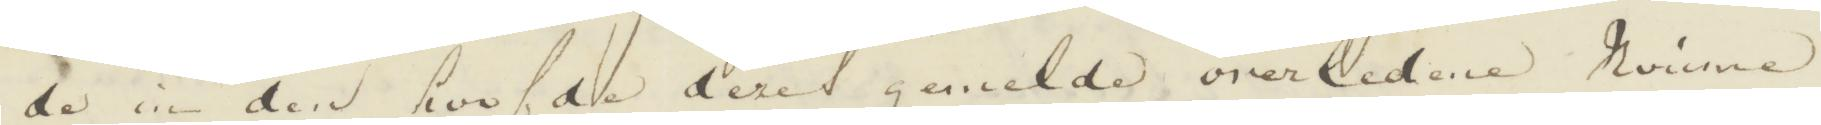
de in den hoofde dezes gemelde overledene Vrouwe
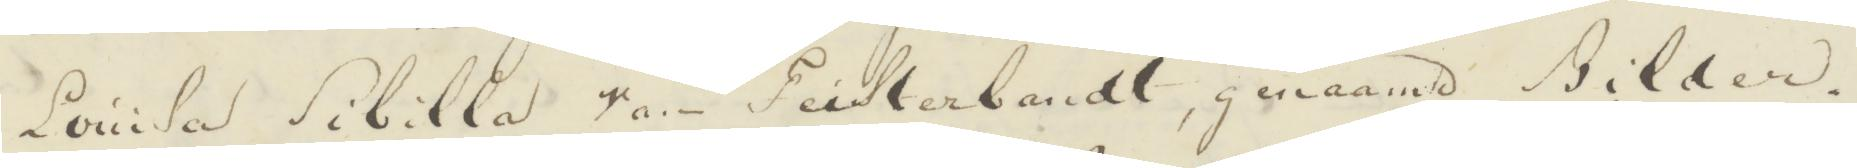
Louisa Sibilla van Feisterbandt, genaamd Bilder.
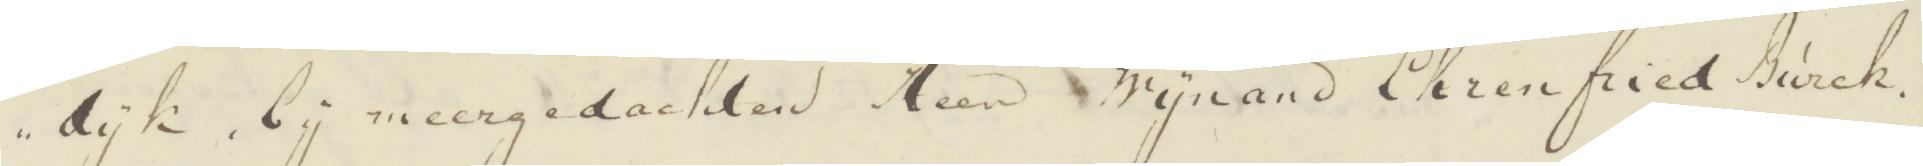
„dijk, bij meergedachten Heen Wijnand Ehrenfried Burch„
